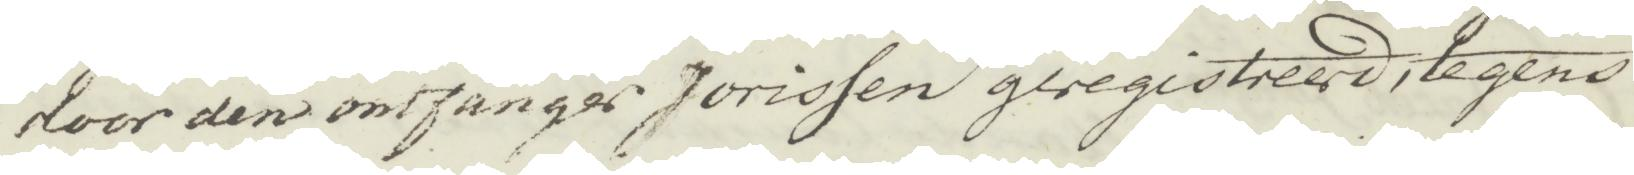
door den ontfanger Jorissen geregistreerd, tegens
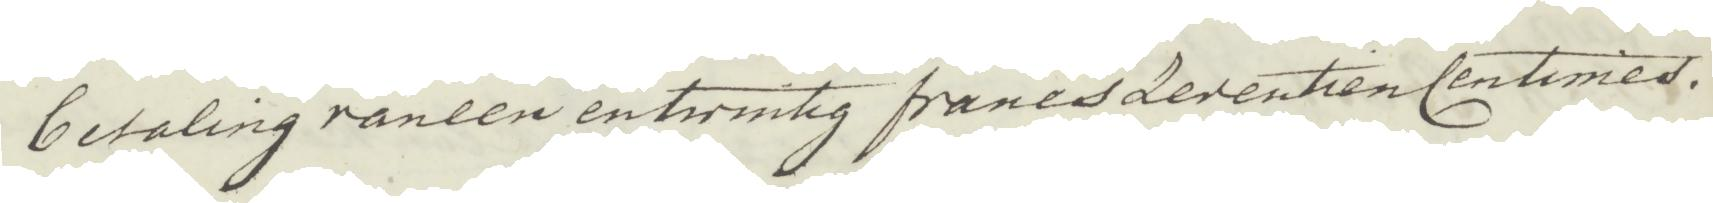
betaling van een en twintig francs Zeventien Centimes.
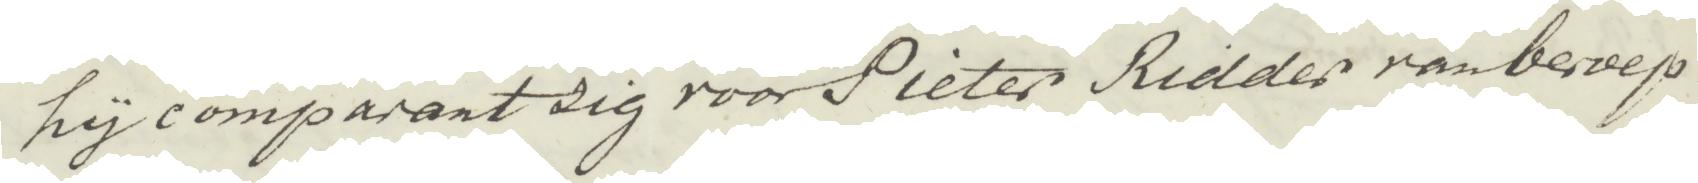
hij comparant zig voor Pieter Ridder van beroep
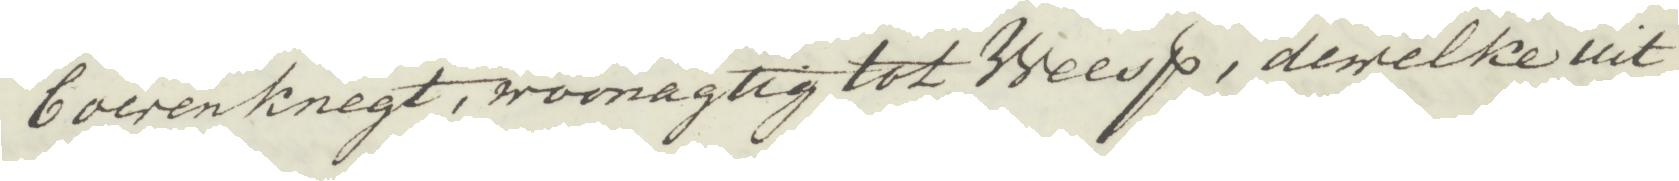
boerenknegt, woonagtig tot Weesp, dewelke uit
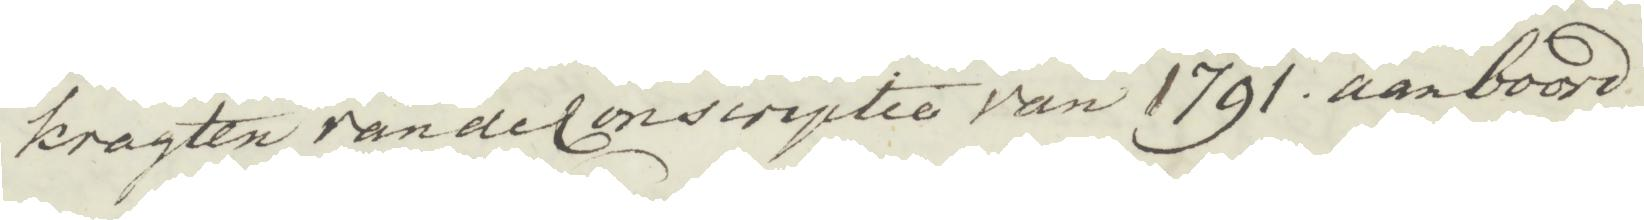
kragten van de conscriptie van 1791. aan boord
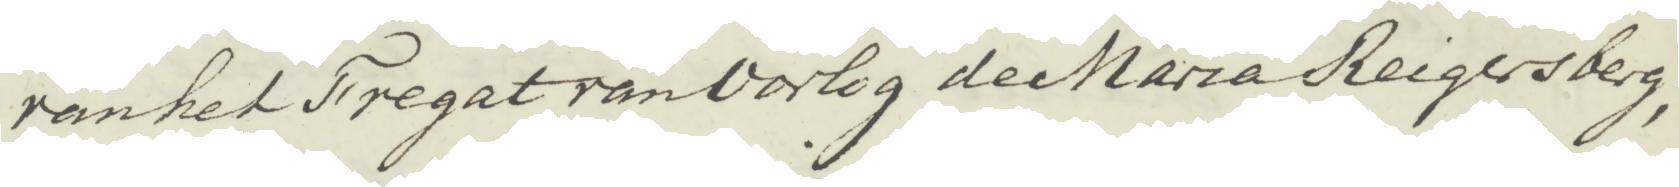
van het Fregat van Oorlog de Maria Reigersberg,
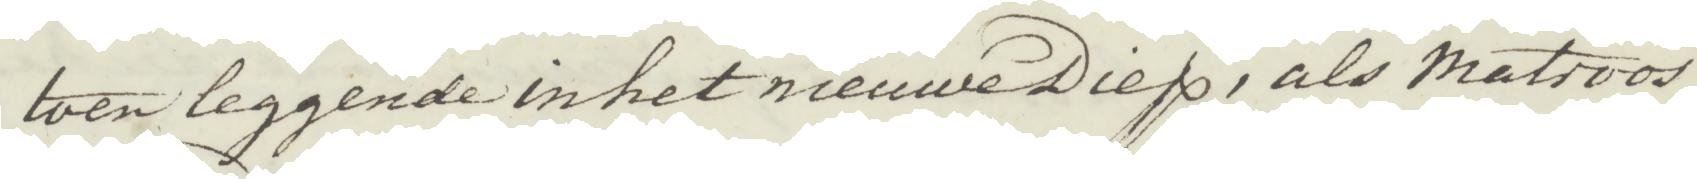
toen leggende in het nieuwe Diep, als Matroos
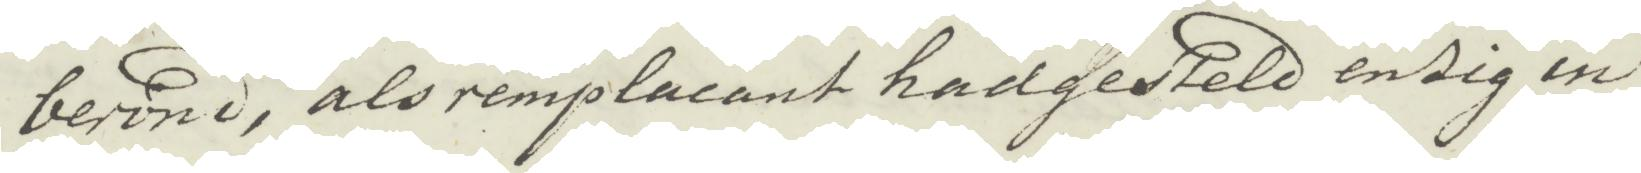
bevond, als remplacant had gesteld en zig in
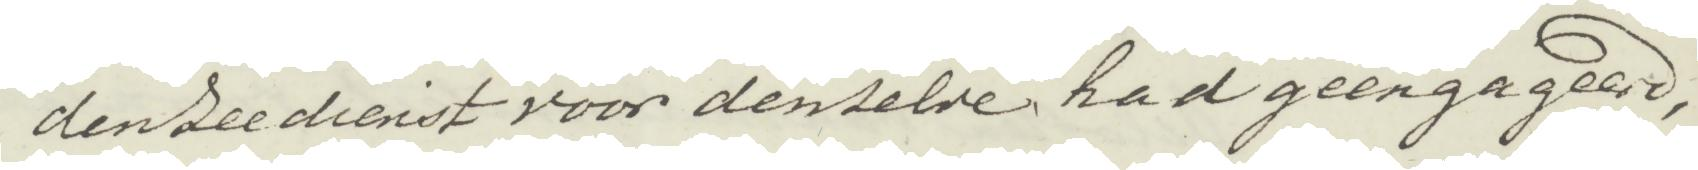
den zeedienst voor denzelve had geengageerd,
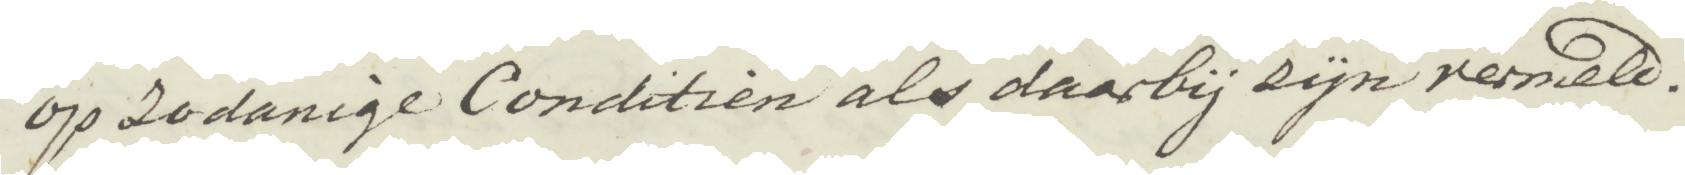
op zodanige Conditien als daarbij zijn vermeld.
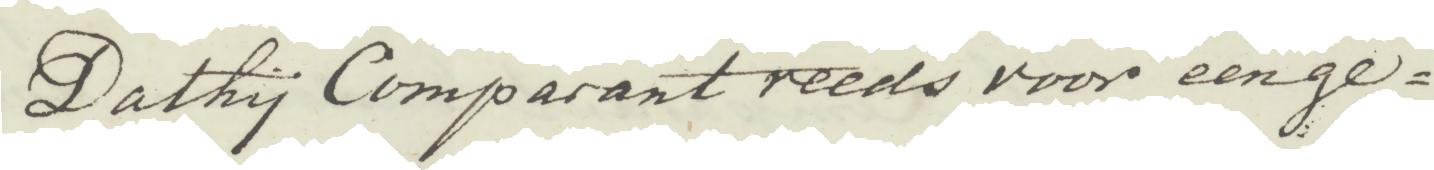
Dat hij Comparant reeds voor een ge=
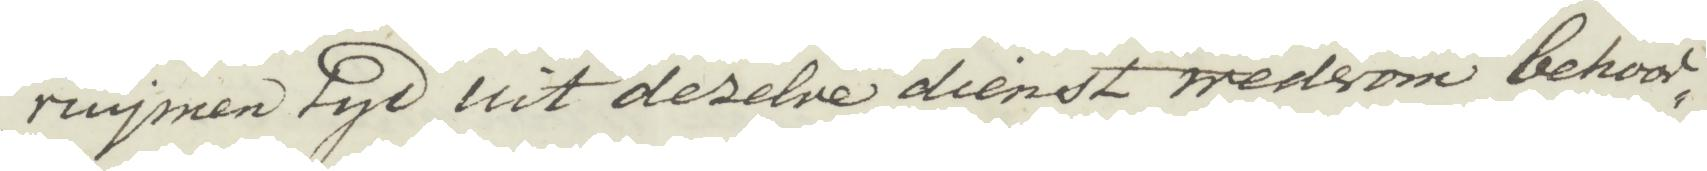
=ruijmen tijd uit dezelve dienst wederom behoor„
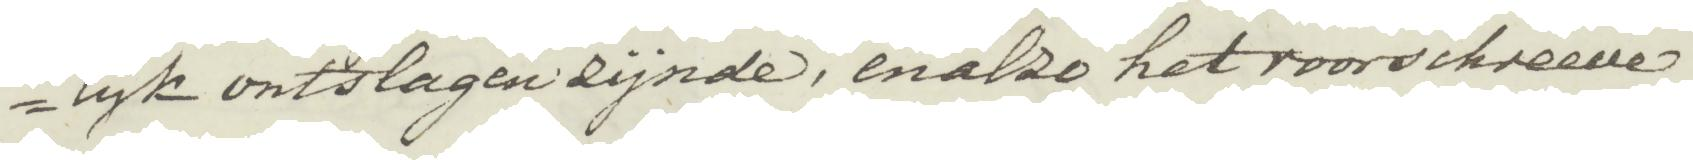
=lyk ontslagen zijnde, en alzo het voorschreeve
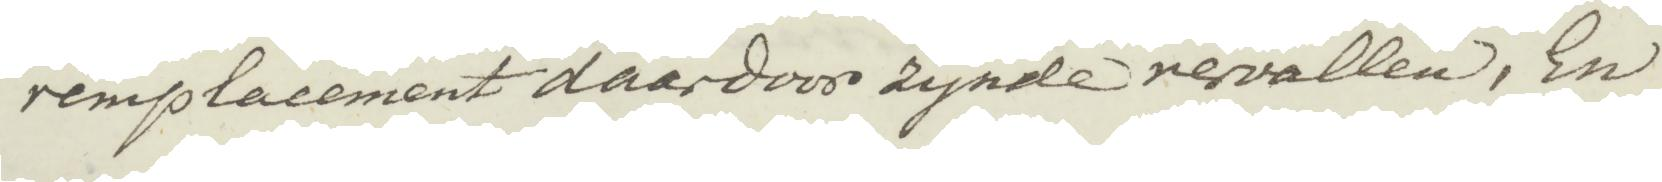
remplacement daardoor zijnde vervallen, En
